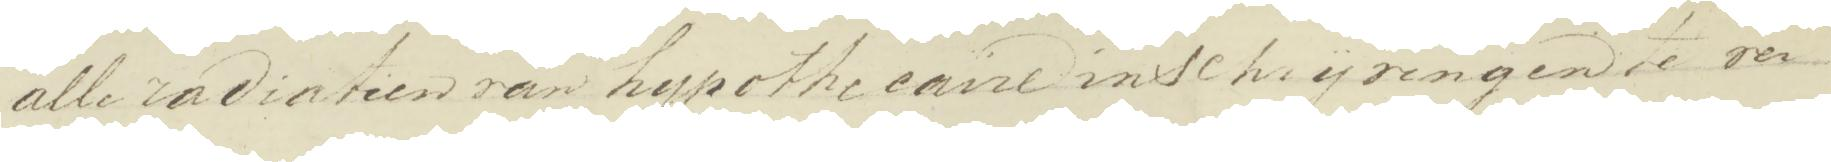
alle radiatien van hypothecaire inschrijvingen te ver
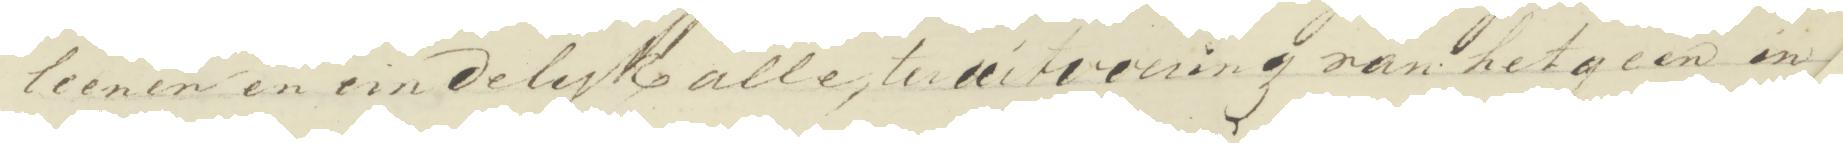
leenen en eindelyk alle, ter uitvoering van hetgeen in
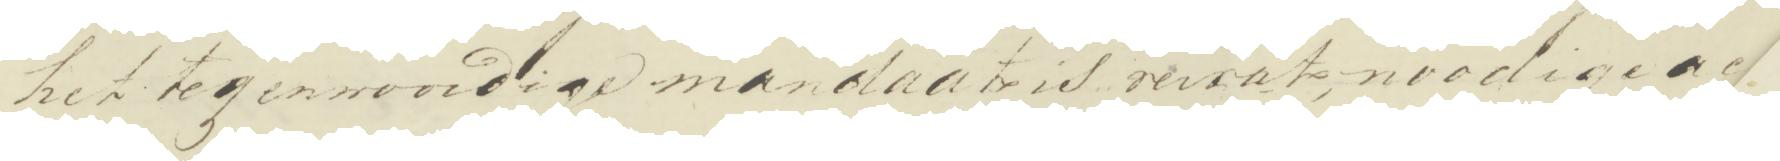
het tegenwoordige mandaat is vervat, noodige ac
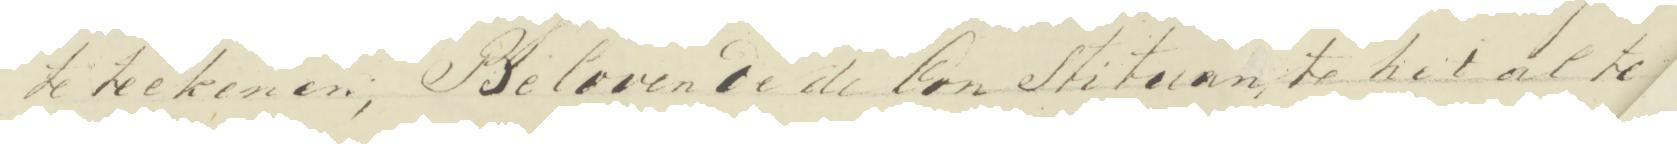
te teekenen, Belovende de Constituante het al te
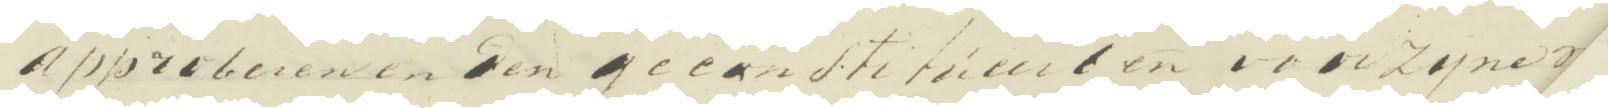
approberen en den geconstitueerten voor zijne v
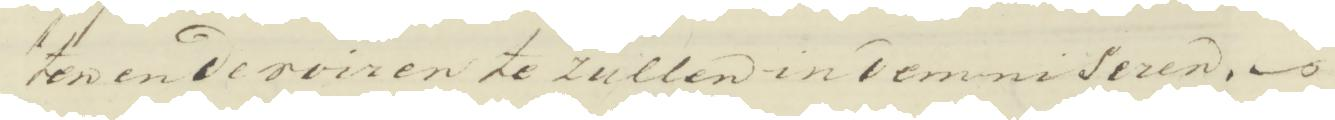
ten en devoiren te zullen in demniseren, —
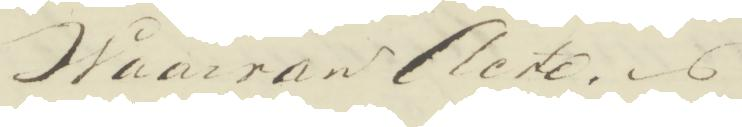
Waarvan Acte. -
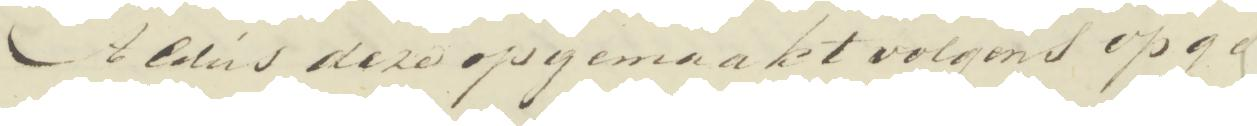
Aldus deze opgemaakt volgens opg
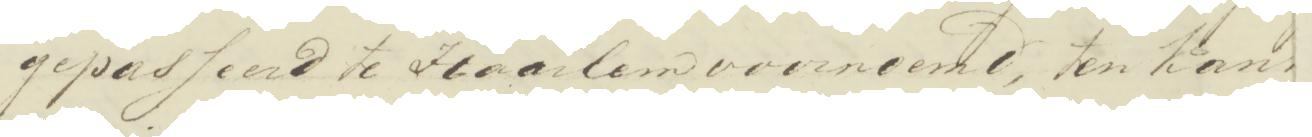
gepasseerd te Haarlem voornoemd, ten kan
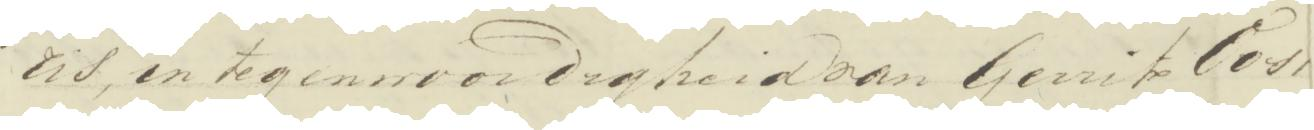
ris, in tegenwoordigheid van Gerrit Cost
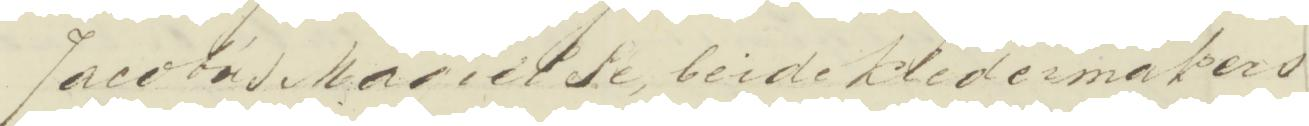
Jacobus Magielse, beide Kledermakers
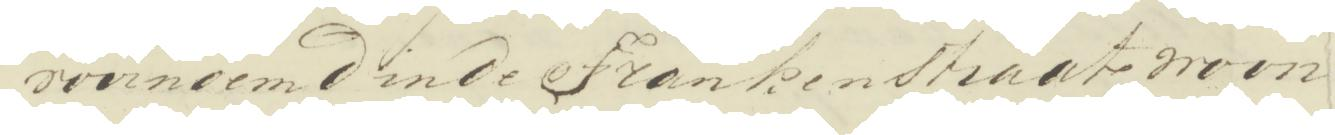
voornoemd in de Frankenstraat woon
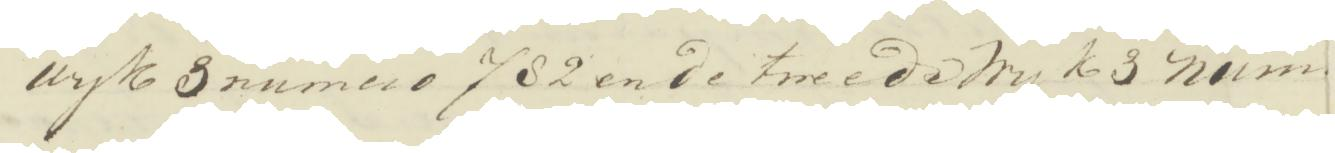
wyk 3 numero 782 en de tweede Wyk 3 num
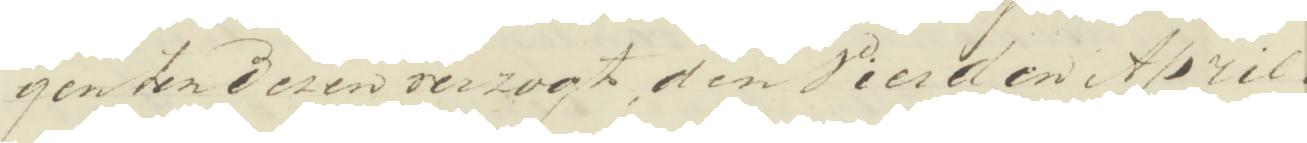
gen ten dezen verzogt den Vierden April
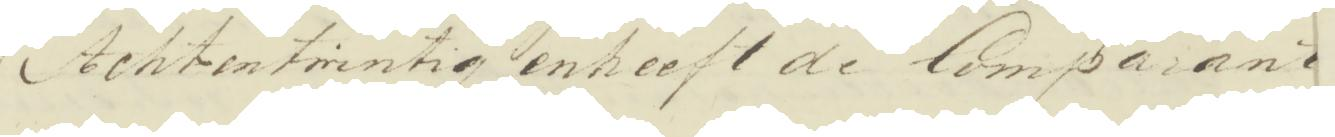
Achtentwintig en heeft de Comparant
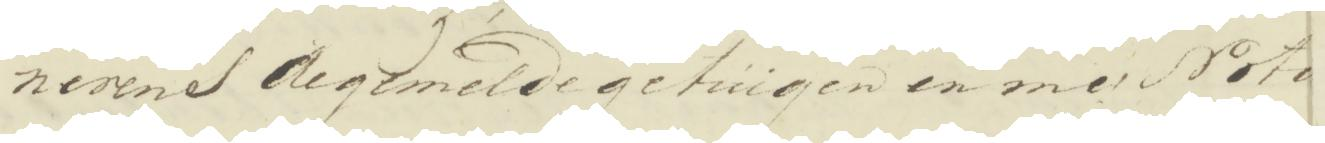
nevens de gemelde getuigen en mij Nota
